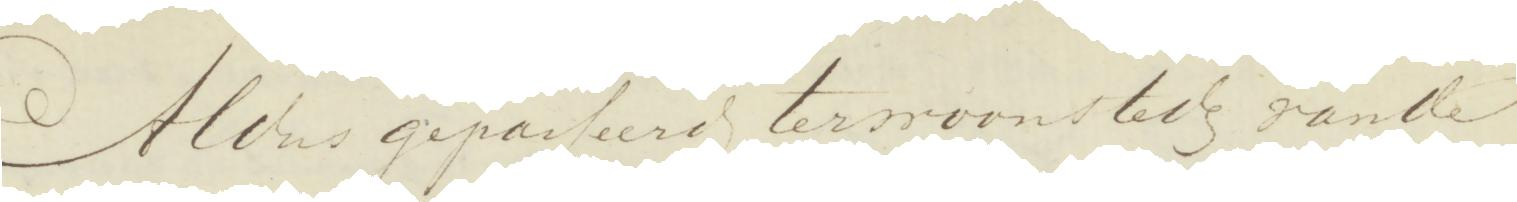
Aldus gepasseerd ter woonstede van de
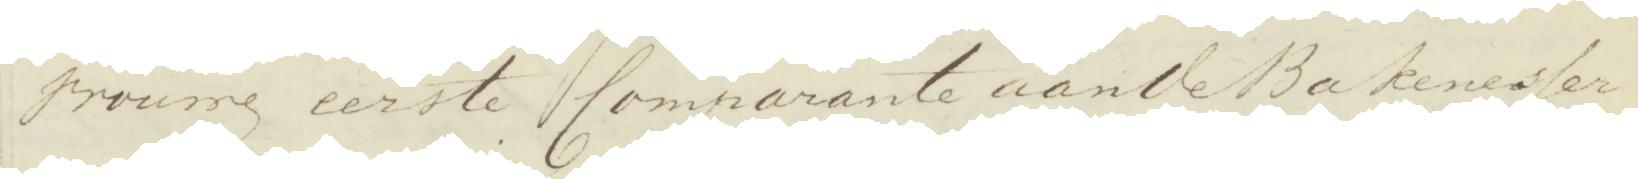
Vrouwe eerste Comparante aande Bakenesser
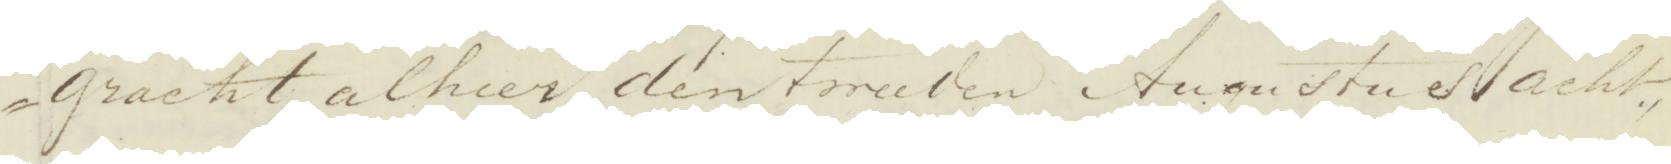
=gracht alhier den tweeden Augustus acht„
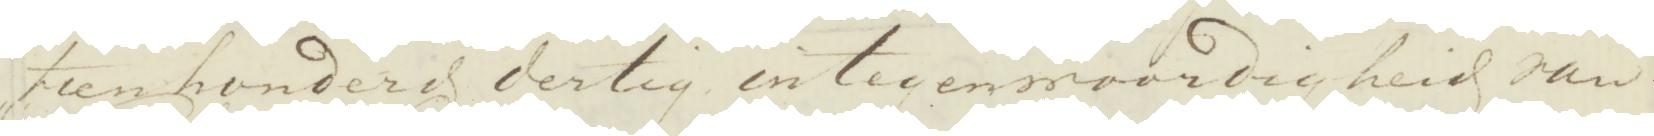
„tien honderd dertig in tegenwoordigheid van
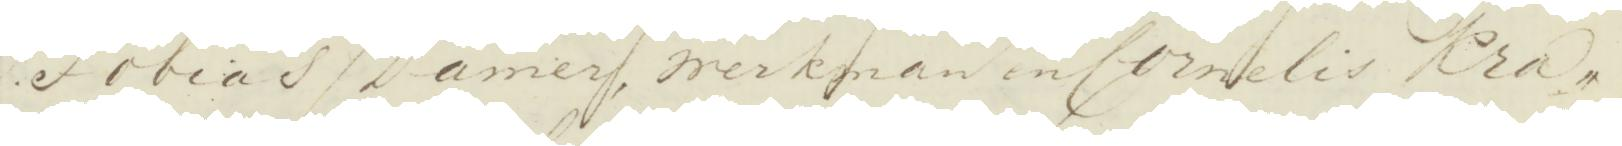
Tobias Damers, werkman en Cornelis Kra„
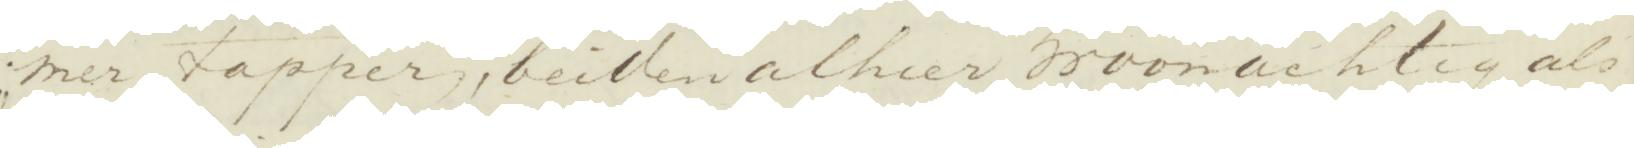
mer, tapper, beiden alhier woonachtig als
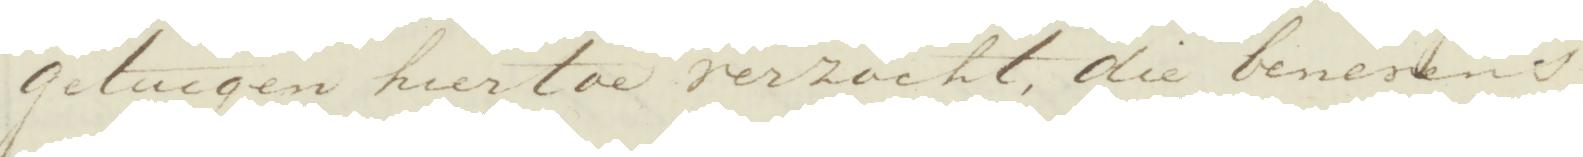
getuigen hiertoe verzocht, die benevens
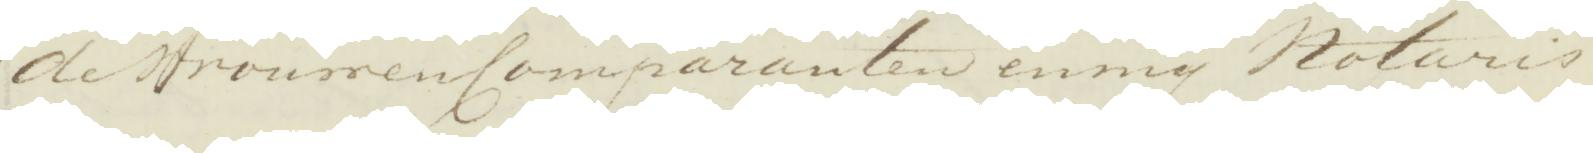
de Vrouwen Comparanten en mij Notaris
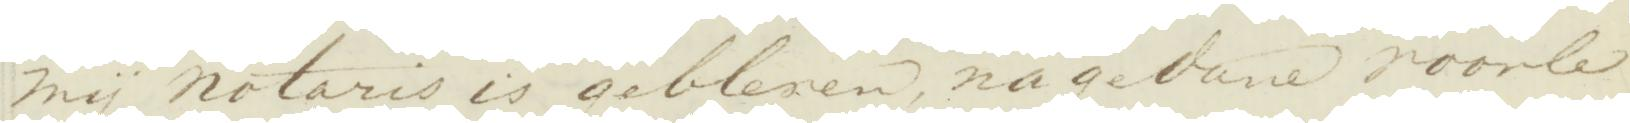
mij notaris is gebleven, na gedane voorle
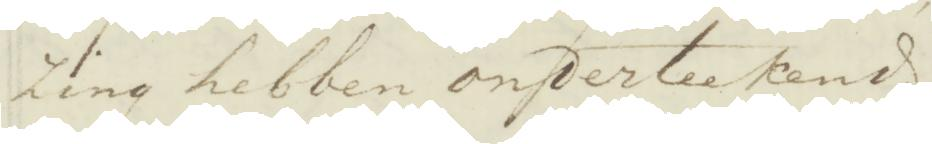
zing hebben onsderteekend
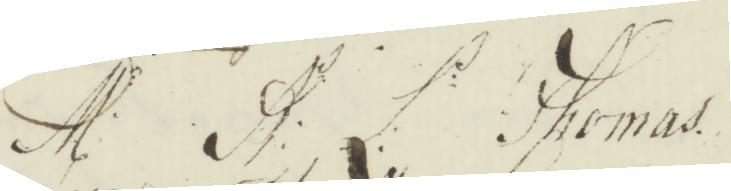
M: A: L: Thomas
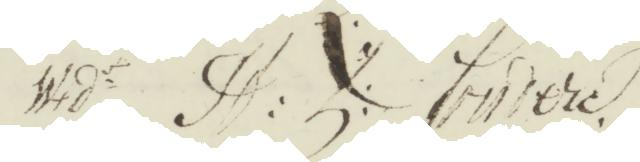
Wed=e H: Z: Couderc
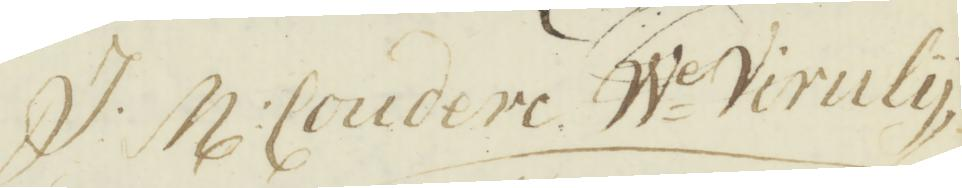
J: M: Couderc W=e Virulij.
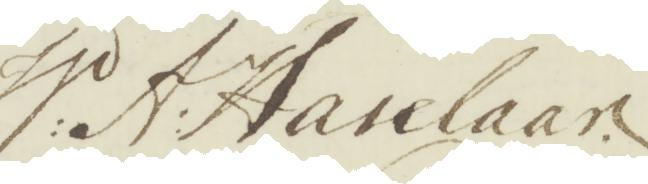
W: A:Haselaar
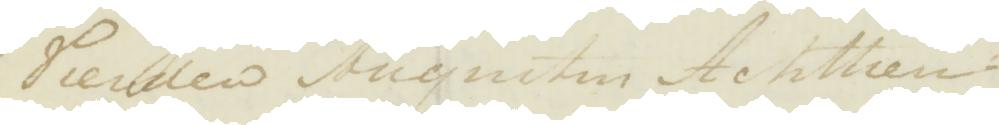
Vierden Augustus Achttien.
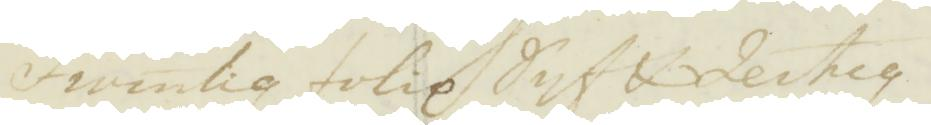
Twintig folio Vijf & Zestig
